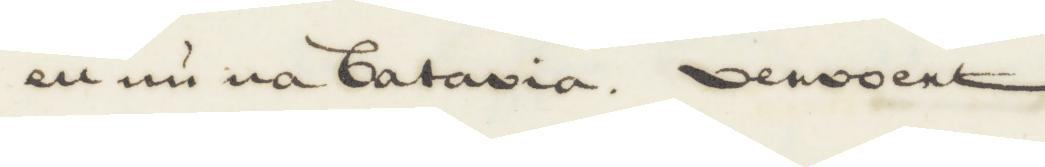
en nu na batavia. vervoert
